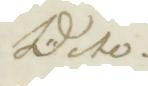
Dito. . . . . . . . .
